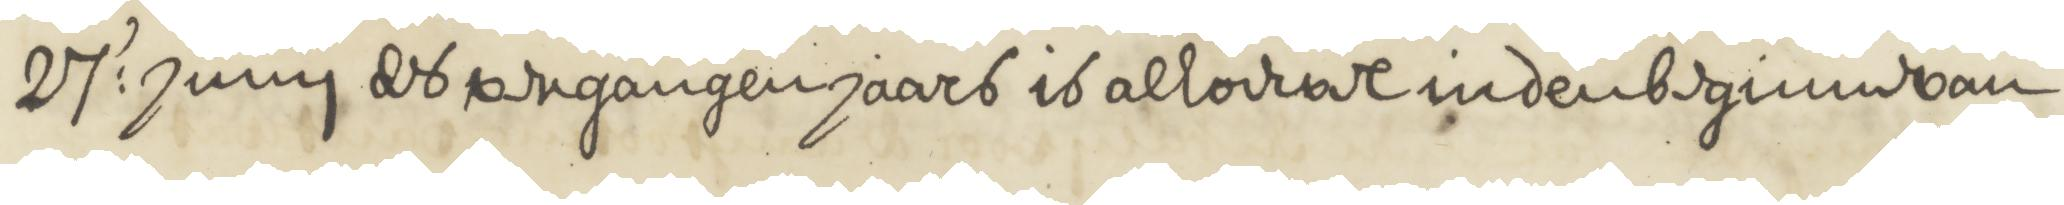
27:' junij des vergangen jaars is alhoewel in den beginne van
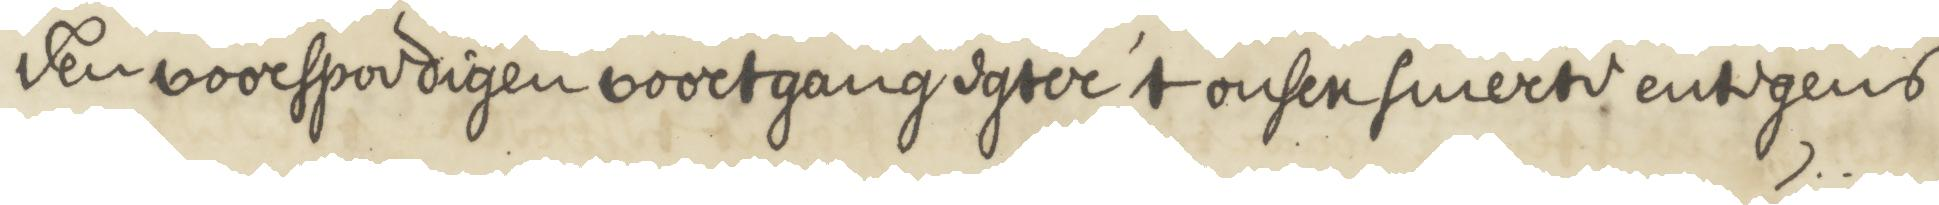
Een voorspoedigen voortgang egter ’t onser smerte en tegens
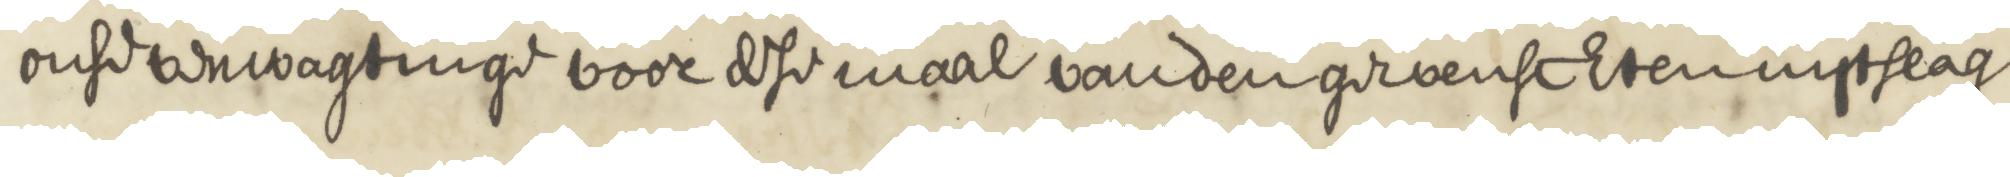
onse verwagtinge voor dese maal van den gewenschten uijtslag
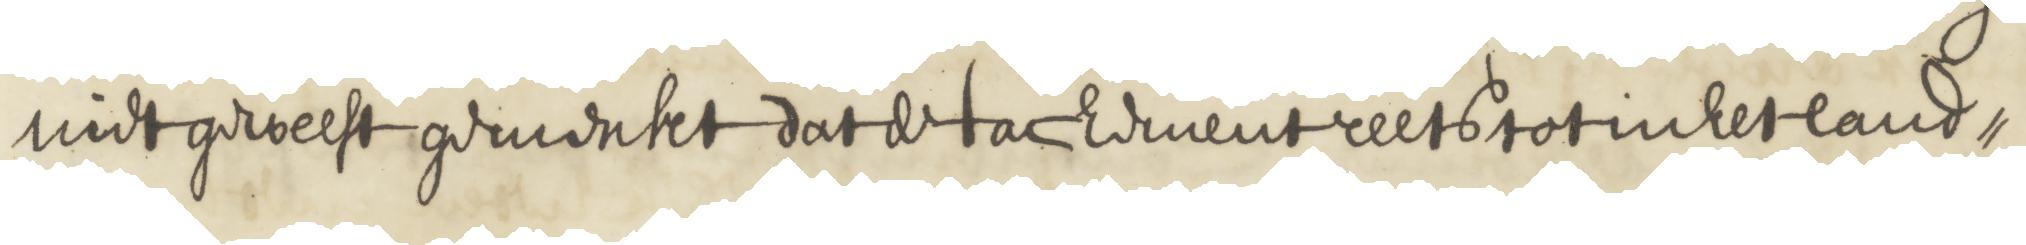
niet geweest gemerkt dat detachement reets tot in het land„
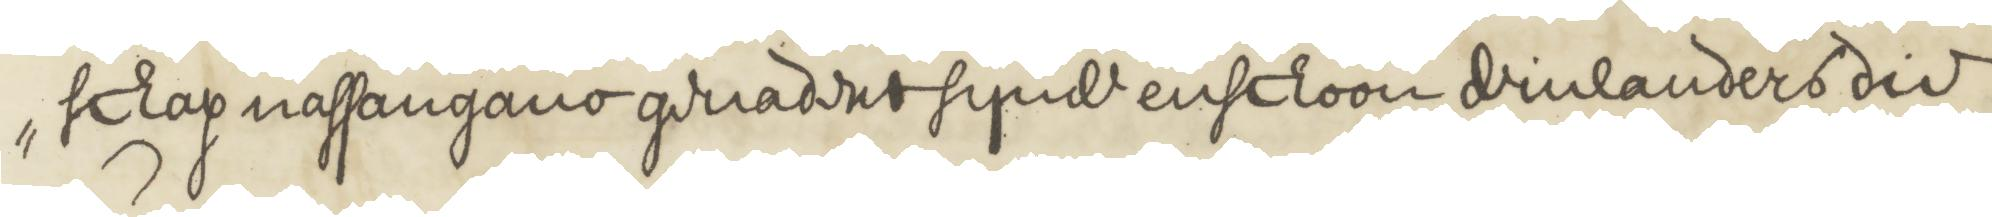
schap nassangano genadert sijnde en schoon de inlanders die
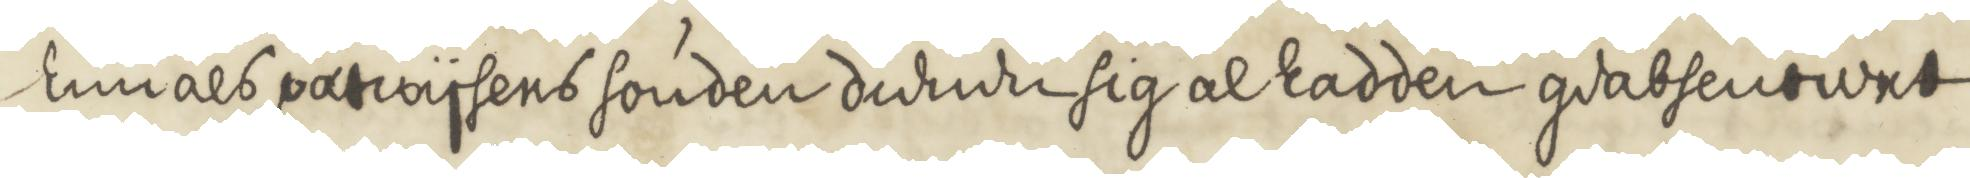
hun als patwijsers souden dienen sig al hadden geabsenteert
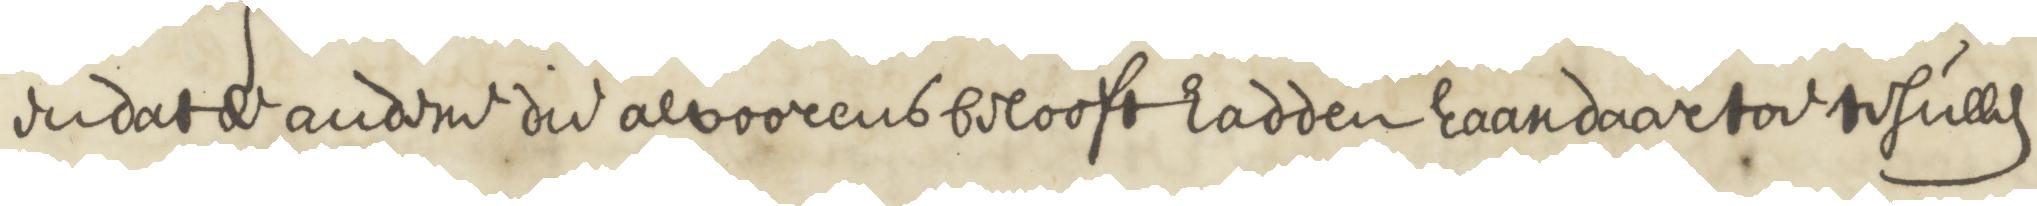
en dat de andere die alvoorens belooft hadden haar daartoe te sullen
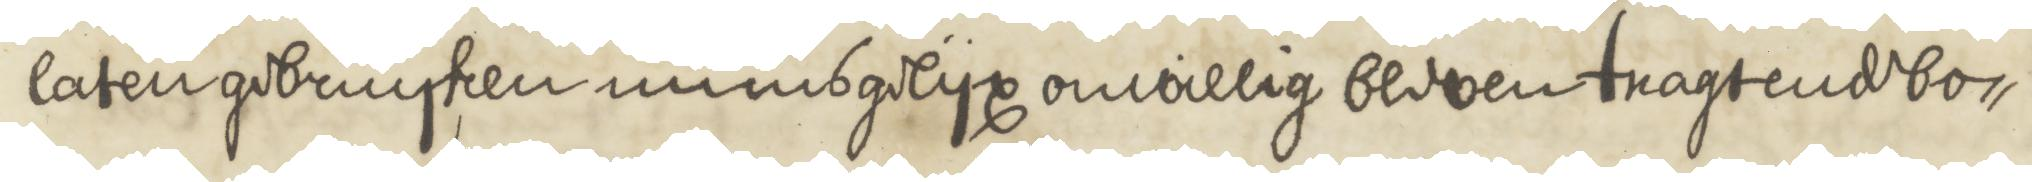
laten gebruijken nu insgelijx onwillig bleven tragtende bo„
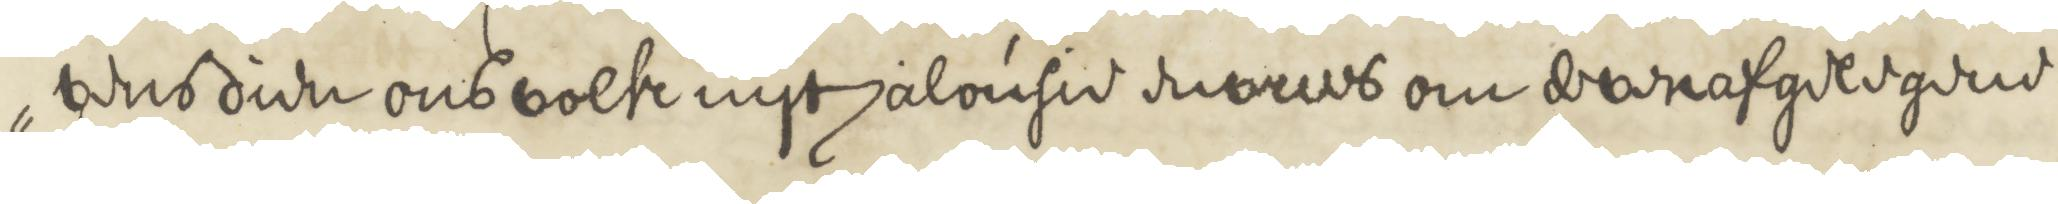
vensdien ons volk uijt jalousie en vrees om de verafgelegene
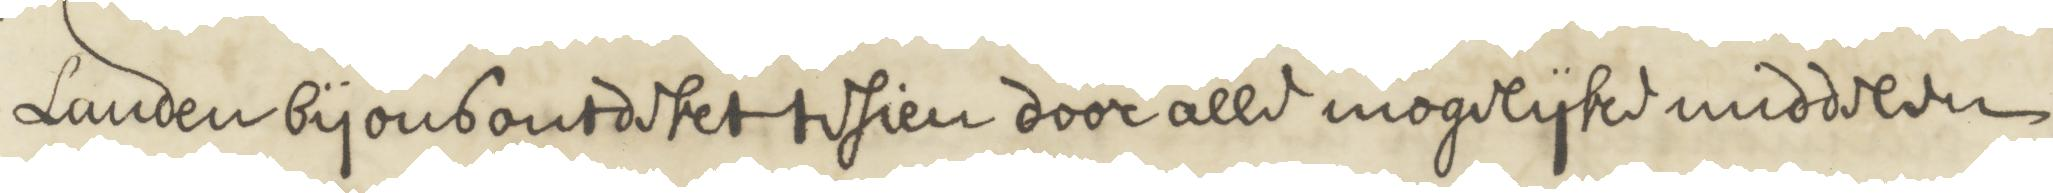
Landen bij ons ontdekt tesien door alle mogelijke middelen
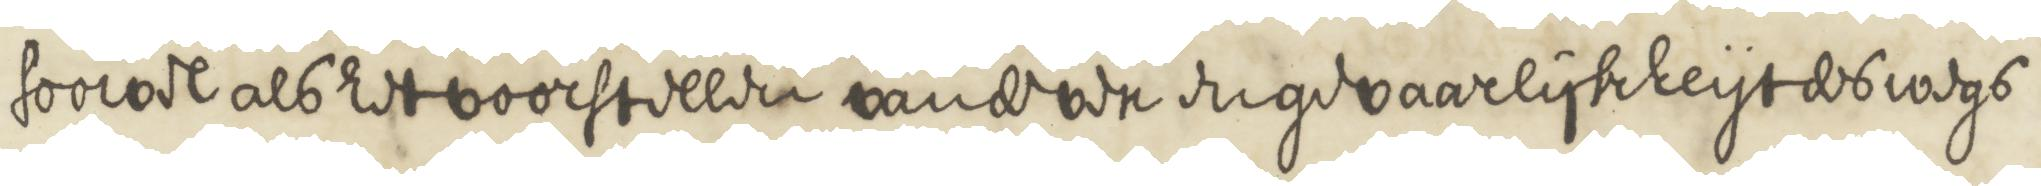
soowel als het voorstellen van de ver en gevaarlijkheijt des wegs
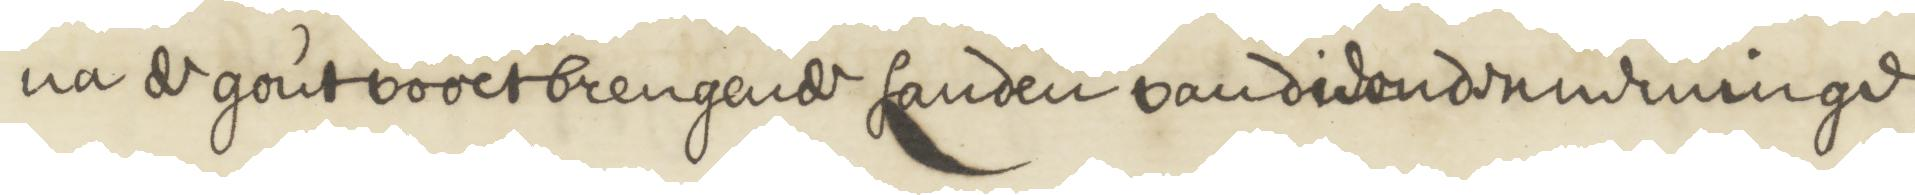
na de gout voortbrengende sanden van die onderneminge
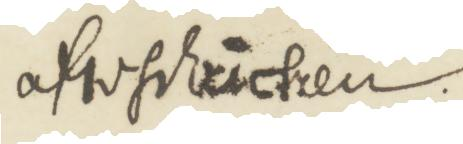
afte schricken.
